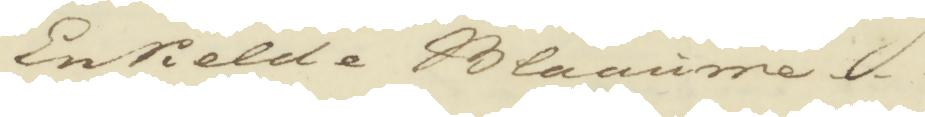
Enkelde Blaauwe
